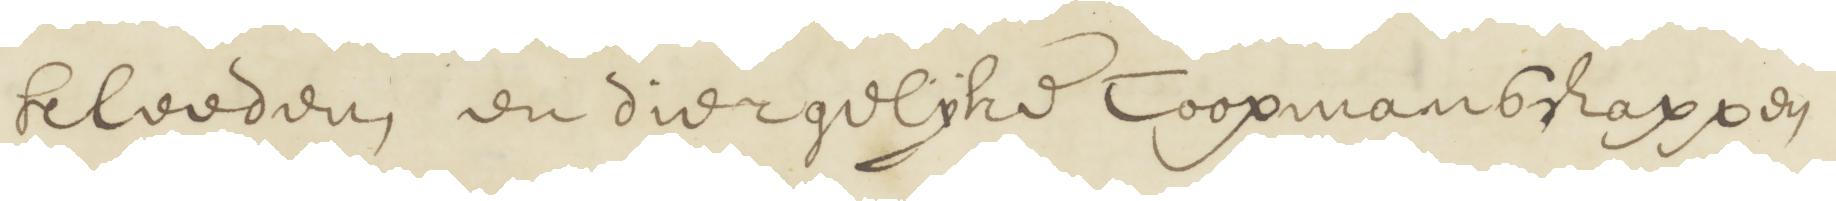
kleeden, en diergelijke coopmanschappen
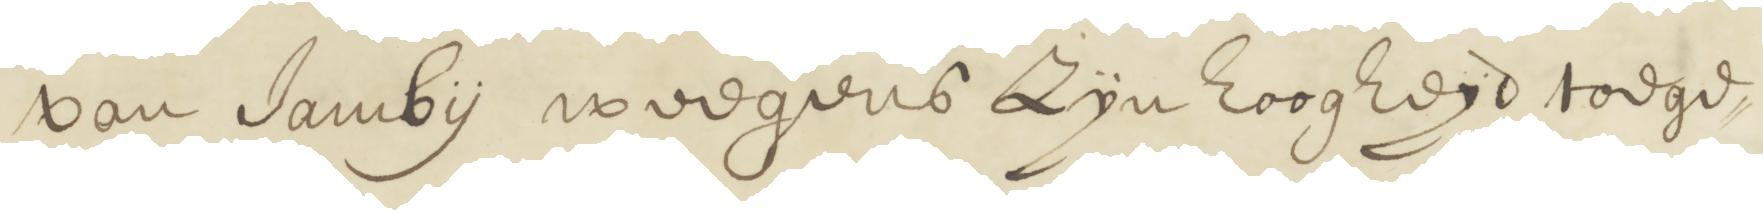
van Jambij weegens zijn hoogheyd toege„
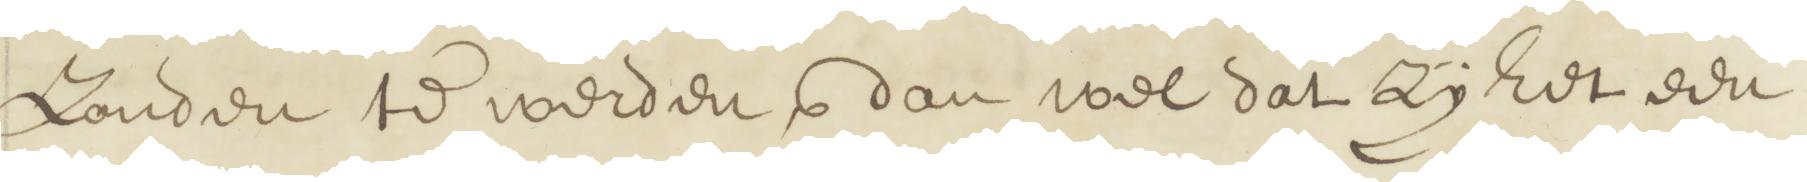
zonden te werden, dan wel dat zij het een
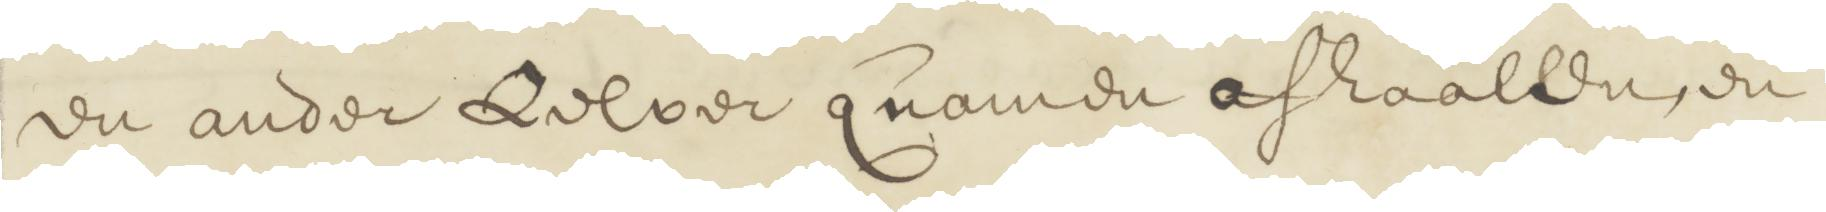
en ander zelver quamen afhaallen, en
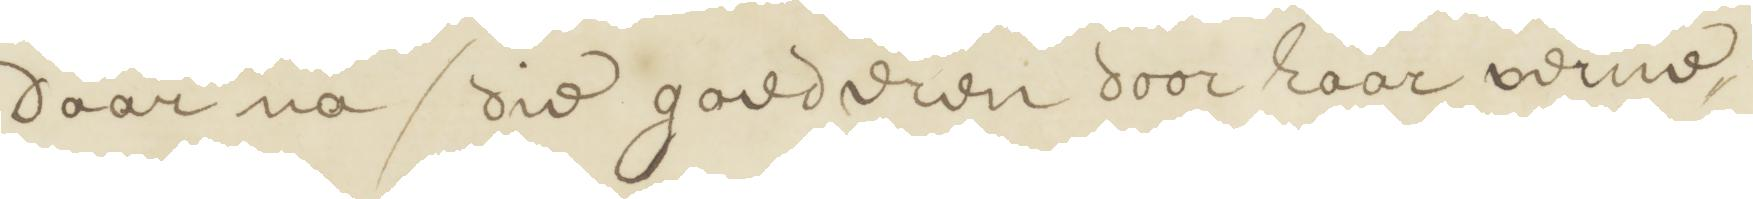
daar na / die goederen door haar verne„
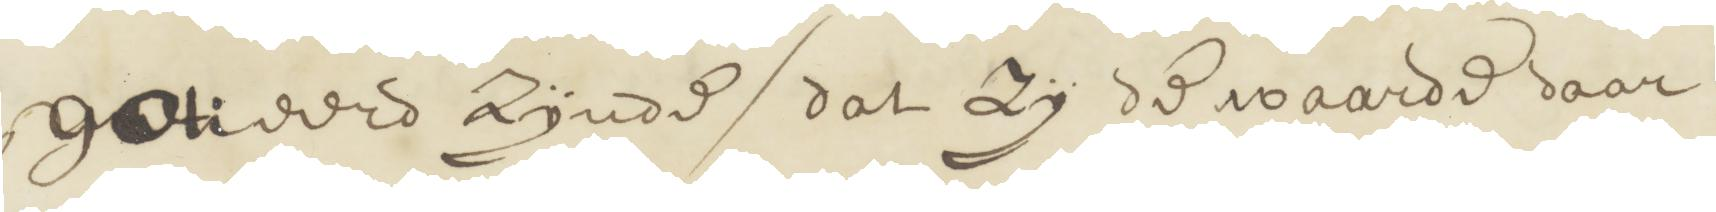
„getieerd zijnde / dat zij de waarde daar
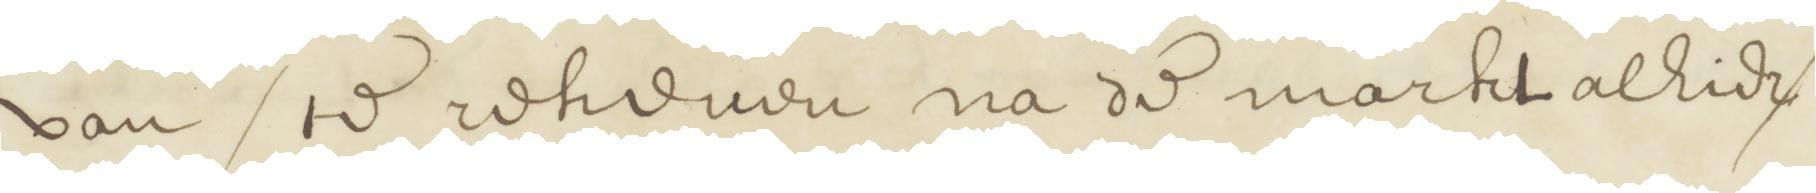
van / te rekenen na de markt alhier/
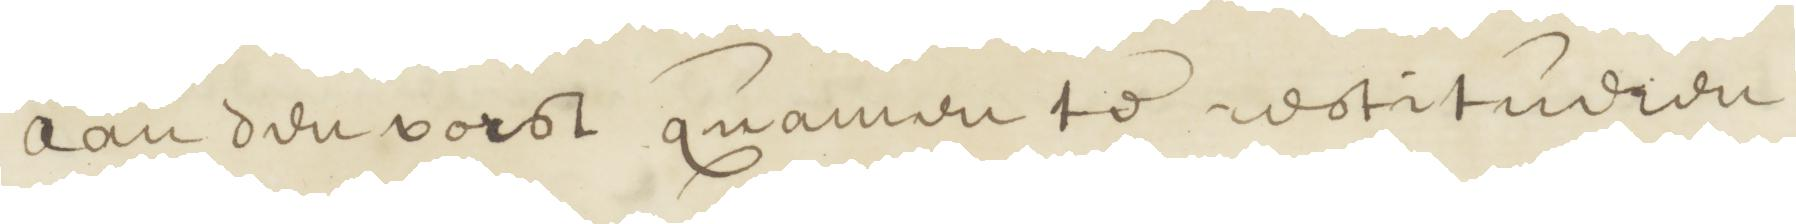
aan den vorst quamen te restitueren
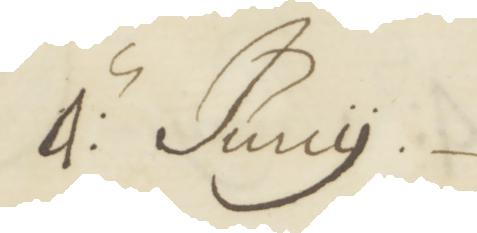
4:' Junij.-
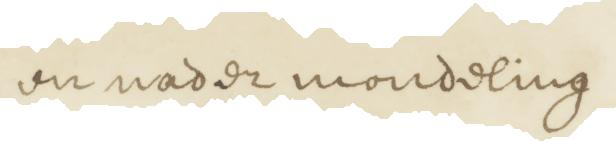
en nader mondeling
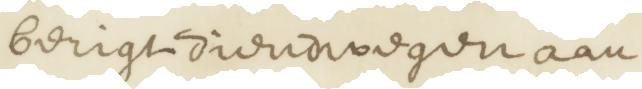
berigt diendwegen aan
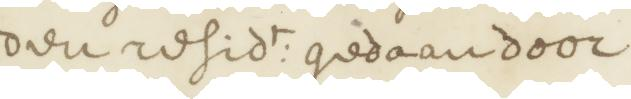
den resid:t gedaan door
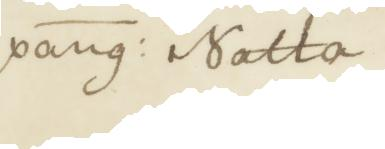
pang: Natta
